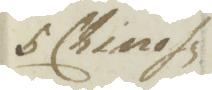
5 Chinesen
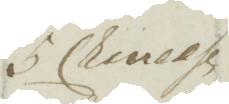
5 Chineesen
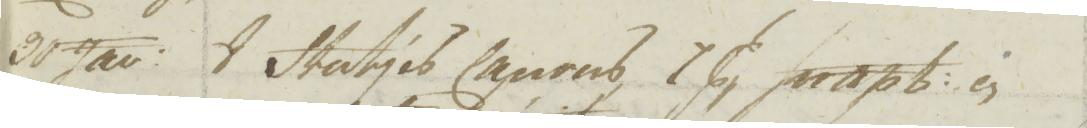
30 Jav: 1 stukjes Canons 7 lb Snaph: en
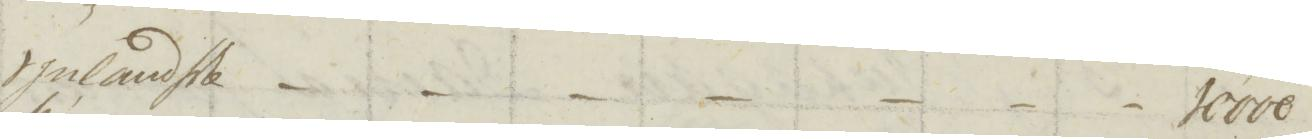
1 Jnlandsche — — — — — — — 10000
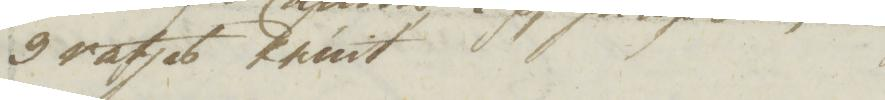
3 vatjes kruit
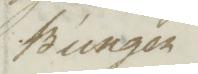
Burger
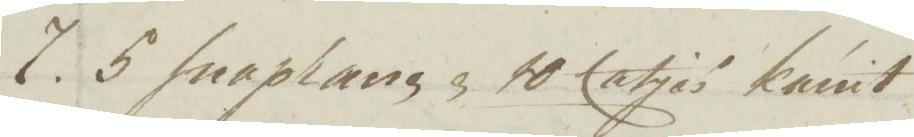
7. 5 snaphanen en 10 Catjes kruit
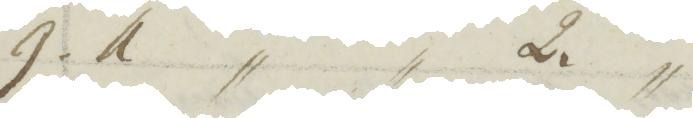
9. 4 „ „ 2. „ „
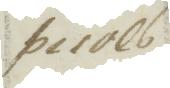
picols
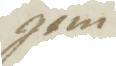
gem
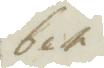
bet
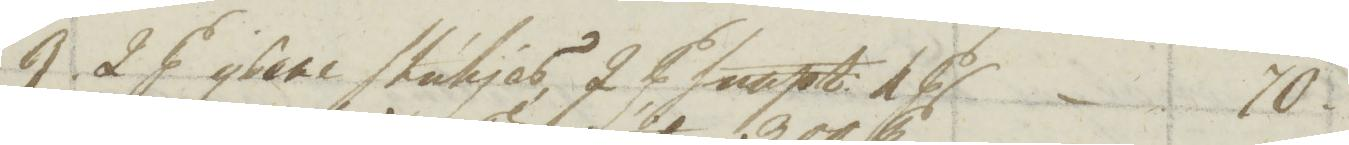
9. 2 p:s ijsere stukjes, 2 p„s snaph: 4 p:s — 70
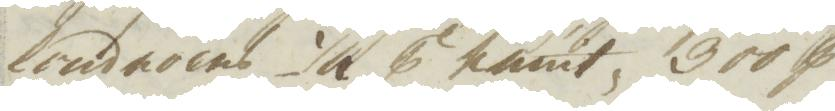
londroers 1/4 p:l kruit en 300 p:s
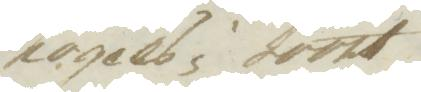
kogels , 'soort
